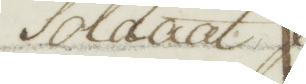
Soldaat
